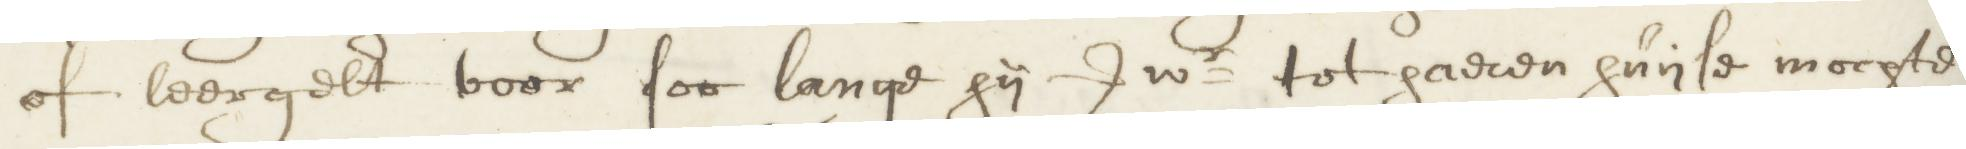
of leergelt voor soo lange hij verw=r tot haeren huijse mochte
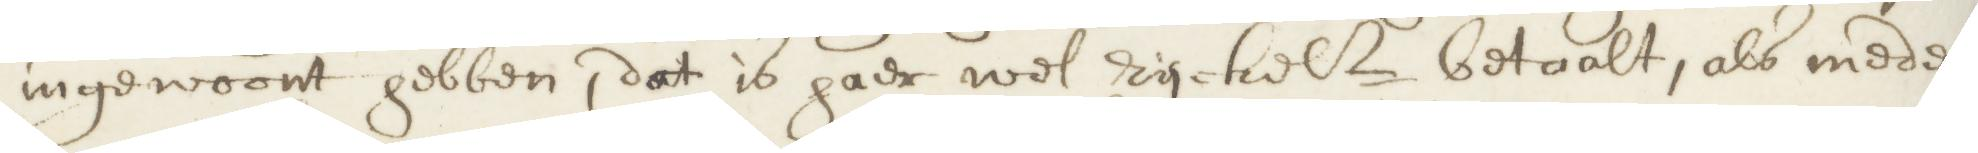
ingewoont hebben, dat is haer wel rijckelijk betaalt, als mede
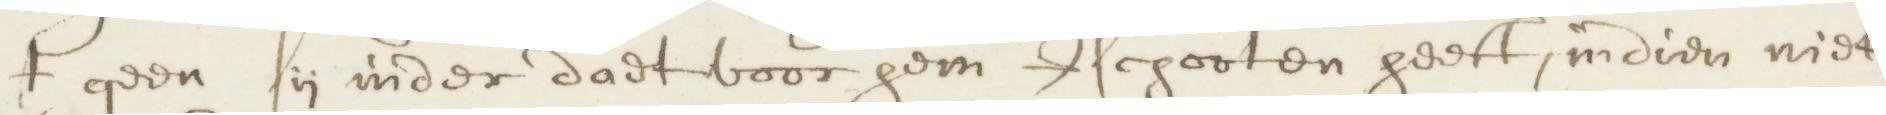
t geen sij inder daet voor gem verschooten heeft, indien niet
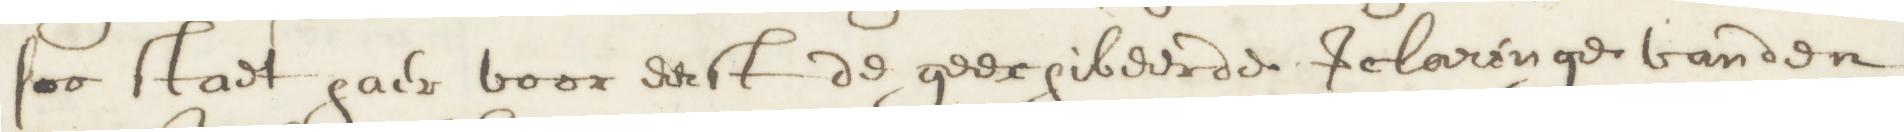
soo staet haer voor eerst de geexhibeerde verclaringe van den
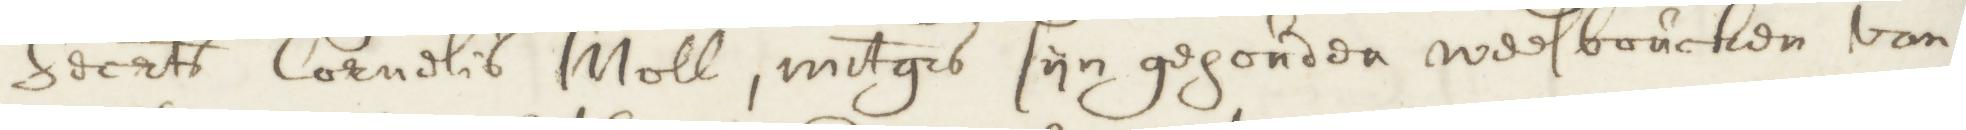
secrts Cornelis Moll, mitgrs sijn gehouden weesboucken van
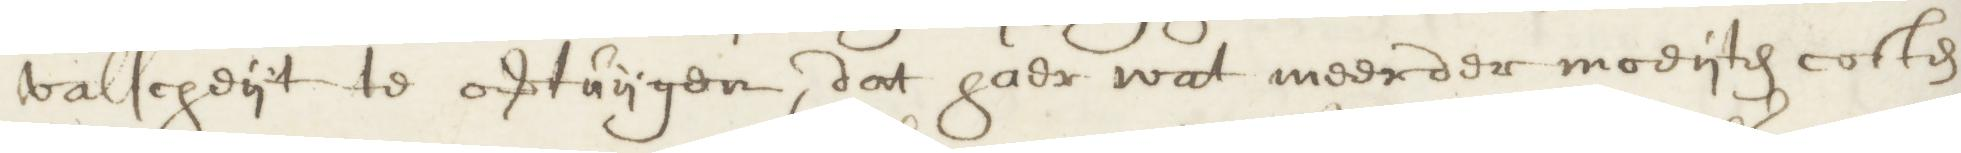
valscheijt te overtuijgen, dat haer wat meerder moeijten costen
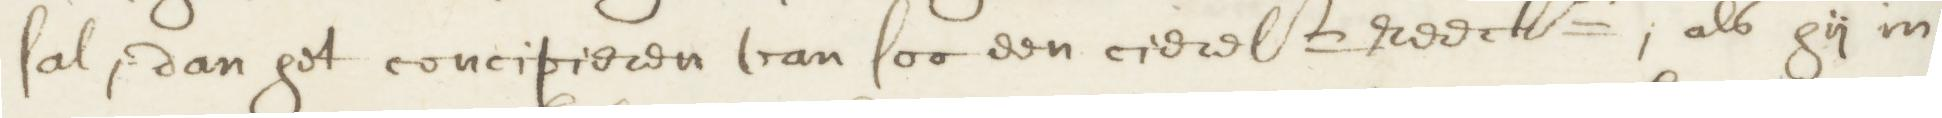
sal dan het concipieren van soo een cierelijk reeck=e; als hij in
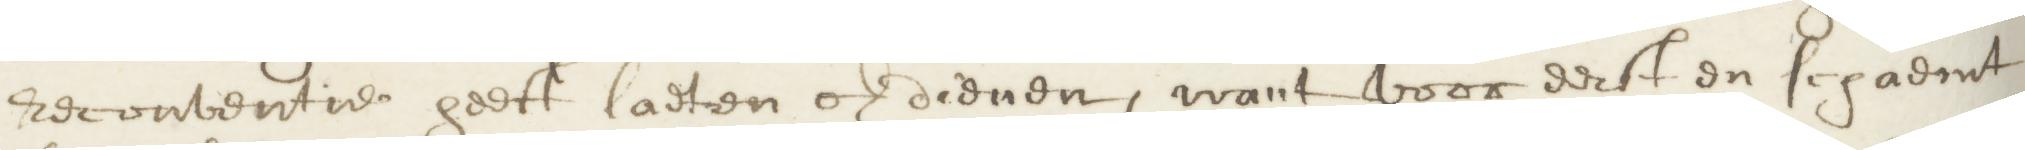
reconventie heeft laeten of dienen, want voor eerst en schaemt
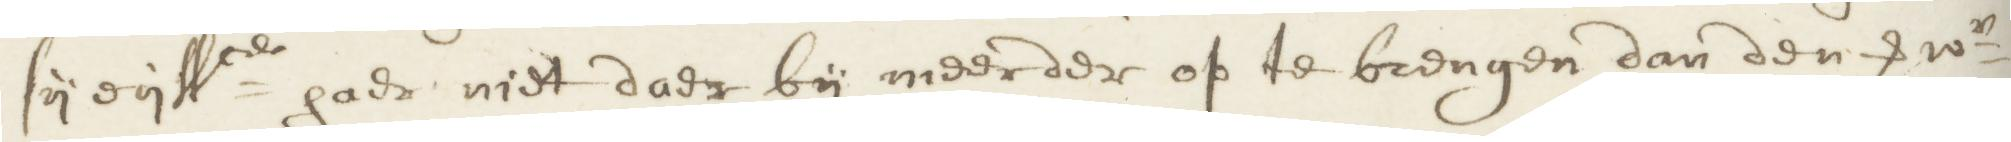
sij eijss=re haer niet daer bij meerder op te brengen dan den verw=r
